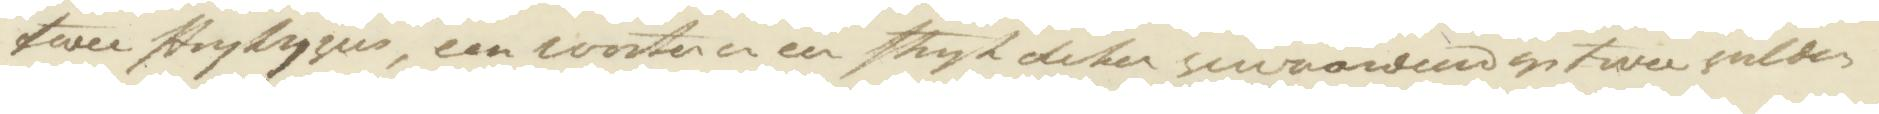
twee strykyzers, een rooster en een strykdeken gewaardend op twee gulden
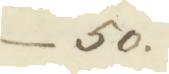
— 50.
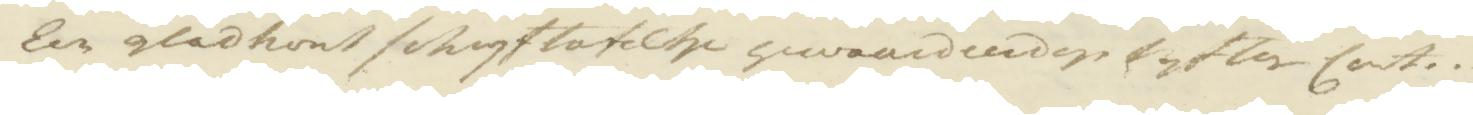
Een gladhout schryftafeltje gewaardeerd op vyftig Cent..
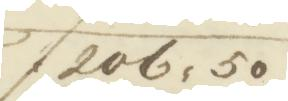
ƒ206„ 50
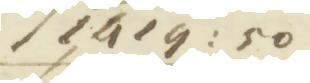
1419 : 50
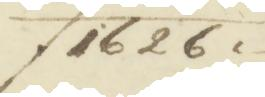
ƒ1626 :
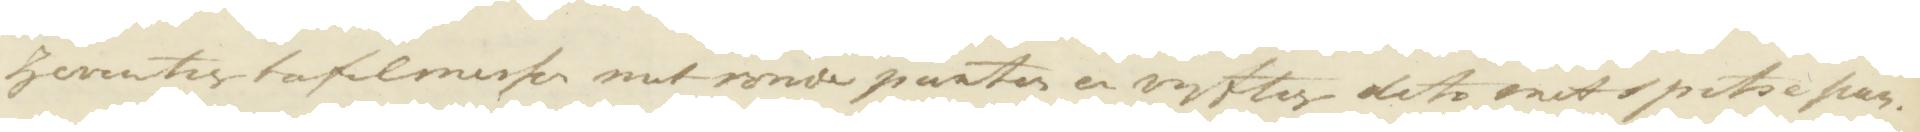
Zeventig tafelmessen met ronde parten en vyftig dito met spitse par„
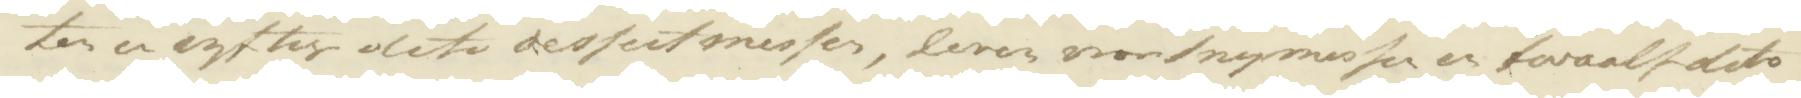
ten en vyftig dito dessert messen, zeven voorsnymessen en twaalf dito
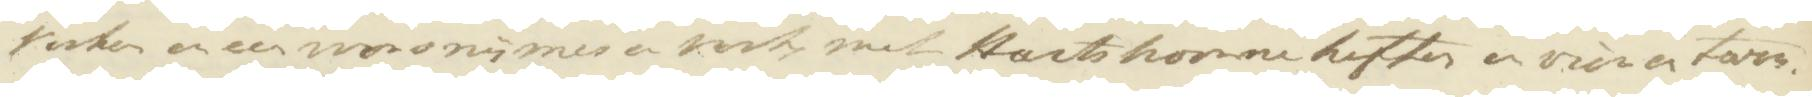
vorken en een voorsnijmes en vork met hartshoorne heften en vier en twin„
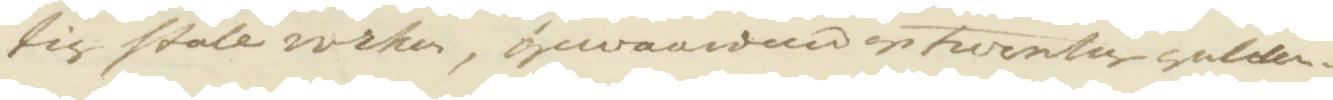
tig stale vorken, gewaardeerd op twintig gulden.
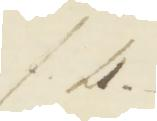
ƒ 14.
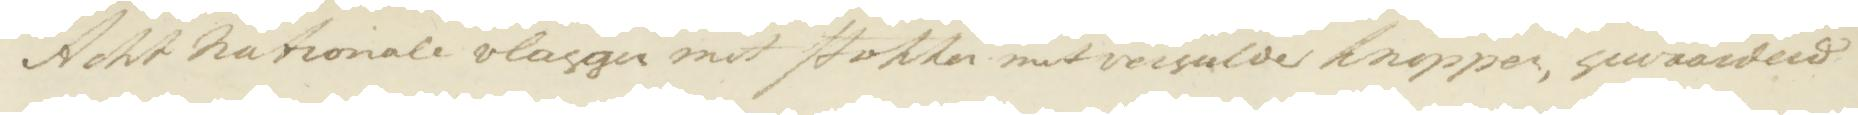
Acht Nationale vlaggen met stokken met vergulde knoppen, gewaardeerd
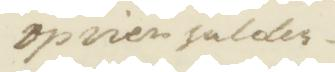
op vier gulden
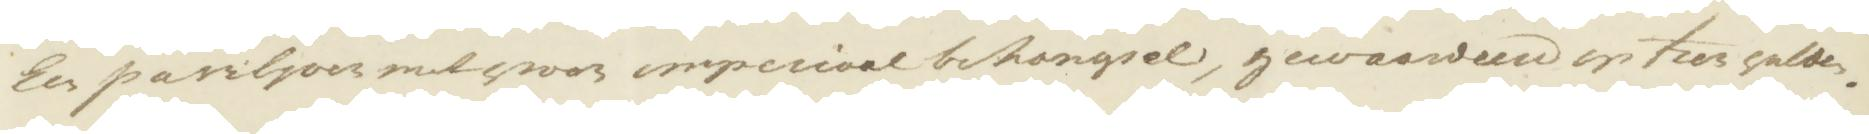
Een paviljoen met groen imperiaal behangsel, gewaardeerd op tien gulden.
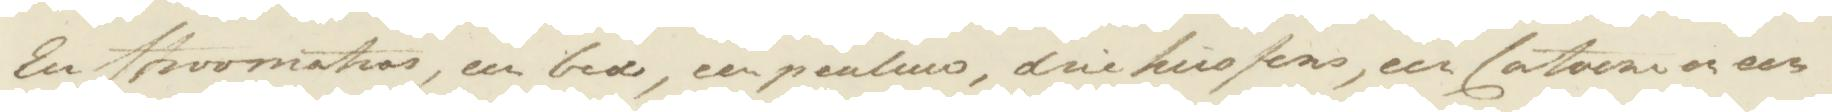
En Stroomatras, een bed, een peuluw, drie kussens, een Catoene en een
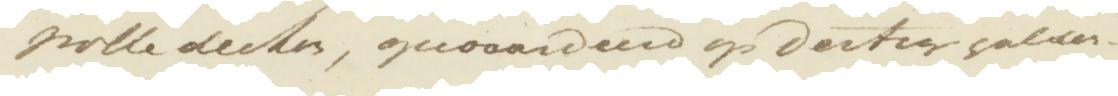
wolle deeken, gewaardeerd op dertig gulden
